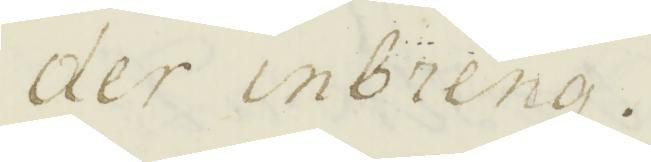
der inbreng.
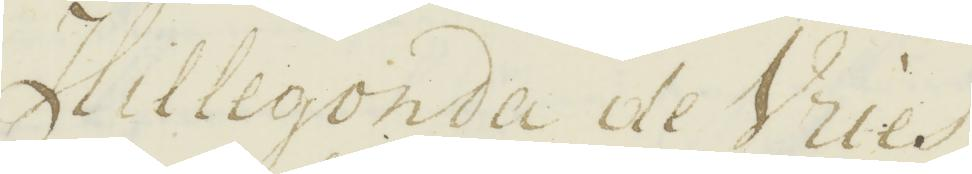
Hillegonda de Vries
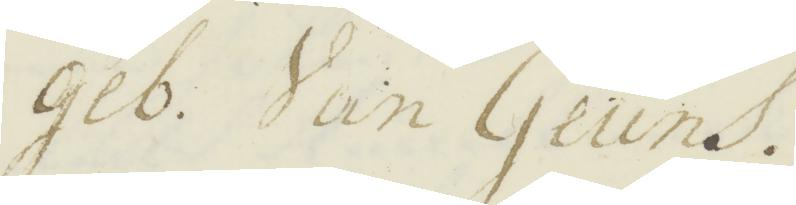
geb: Van Geuns.
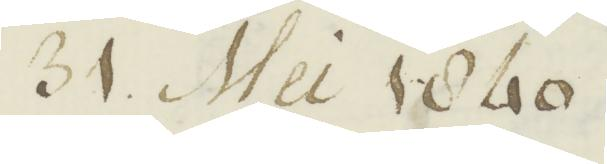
31. Mei 1840
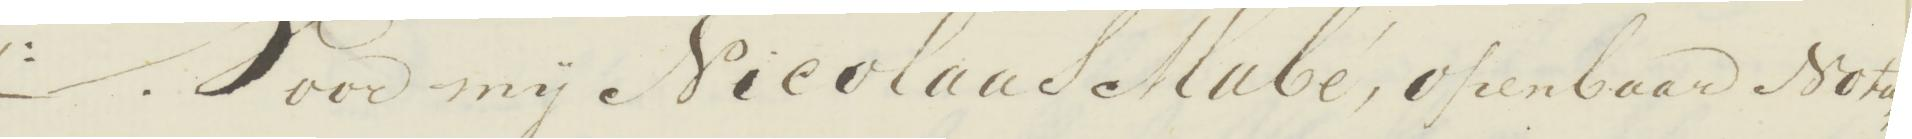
.Voor mij Nicolaas Mabé, openbaar Nota
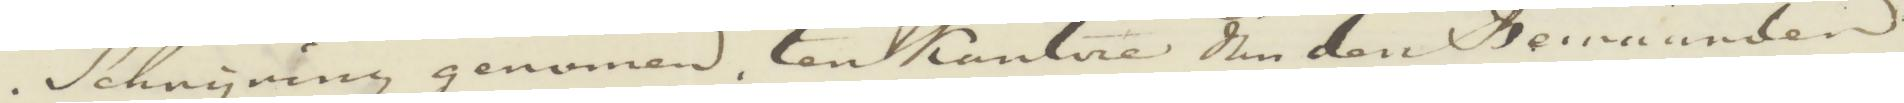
„schrijving genomen, ten Kantore van den Bewaarden
